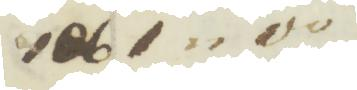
106 1 „ d:o
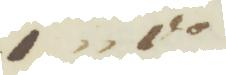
107 1 „ d:o
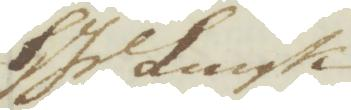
G Jv Luyk
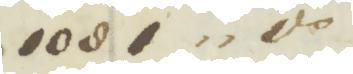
108 1 d:o
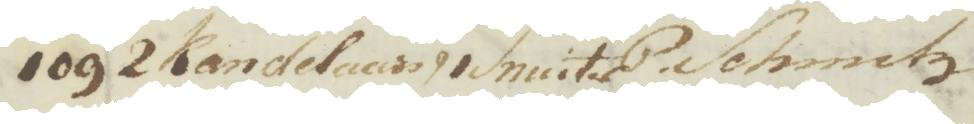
109 2 Kandelaars, 1 Snuiter P. Schmitz
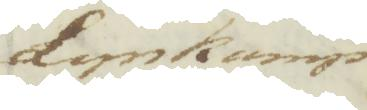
Lynkamp
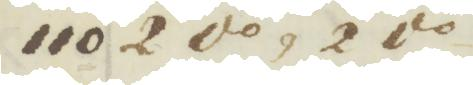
110 2 d:o „ 2 d:o
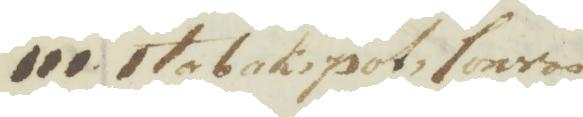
111 1 tabakspot, Convoor
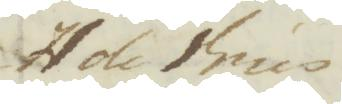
H de Vries
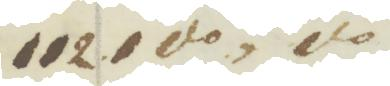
112 1 d:o„ d:o
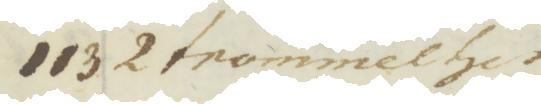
113 2 trommeltjes
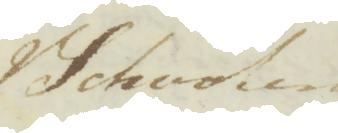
VSchooten.
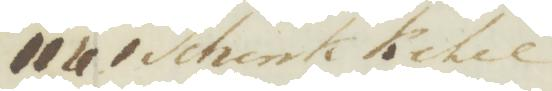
114 1 schenkketel
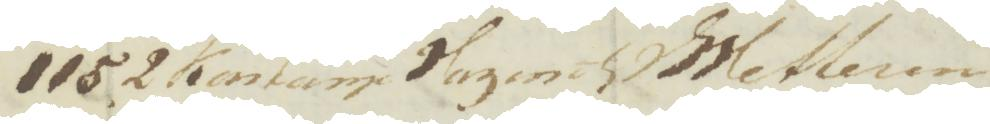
115 2 Kastanje Vazen GVWetteren
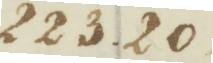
223.20
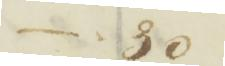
-.30
